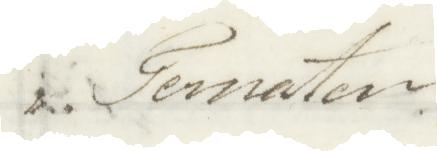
„ Ternaten
